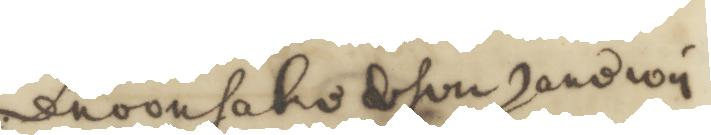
tenoorsake desen Jare wij
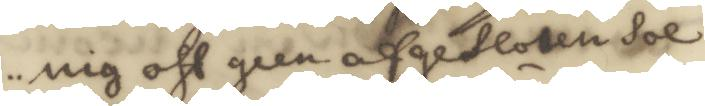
„nig off geen afgesloten sol
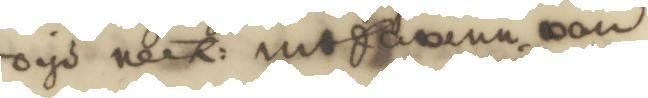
dije reek: intfaveur, van
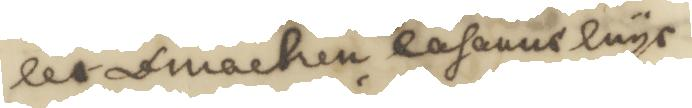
het temaeken lasarus huijs
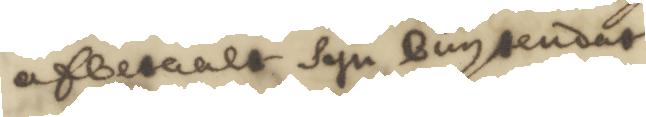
afbetaalt sijn buytendat
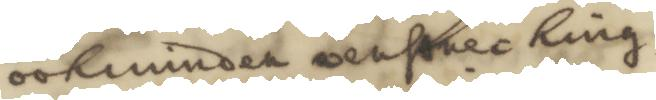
ookminder verstrecking
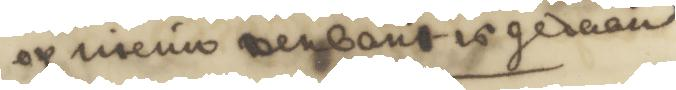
op nieuw verbant is gedaan
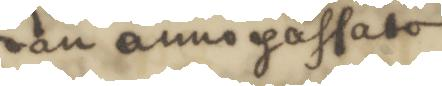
van anno passato
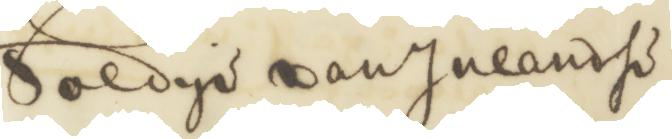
Soldije vanJnlandse
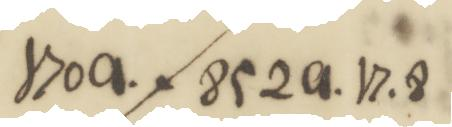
1704. ƒ 8524.17.8
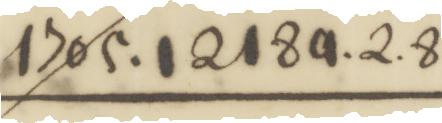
1705.12184.2.8
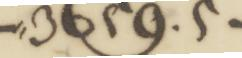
„ 3659.5-
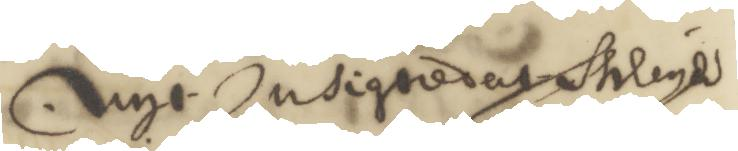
Uijt Jnsigtedat verscheijde
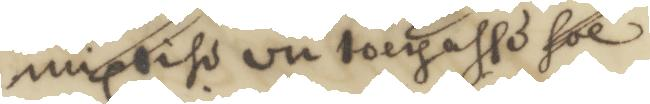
mixtise en toepasse sol
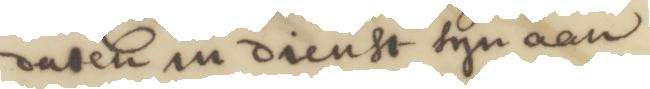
daten in dienst sijn aan
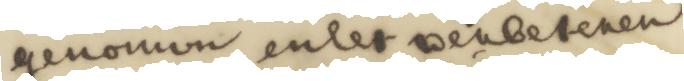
genomen, enhet verbeteren
